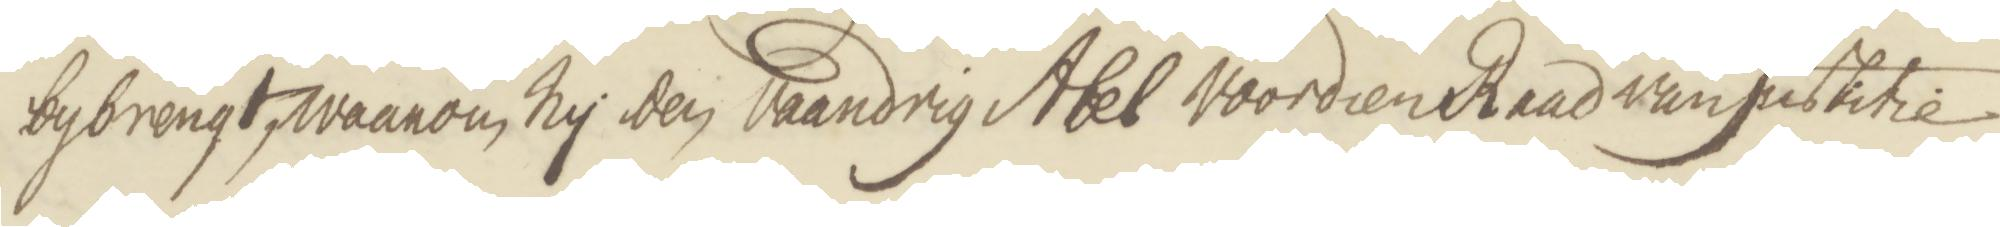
bybrengt, waarom hij den vaandrig Abel voordien Raad van justitie
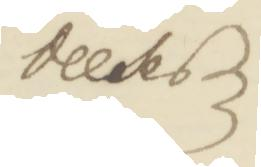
deeses
